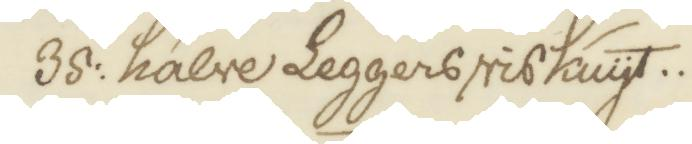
35: halve Leggers viskuijt.
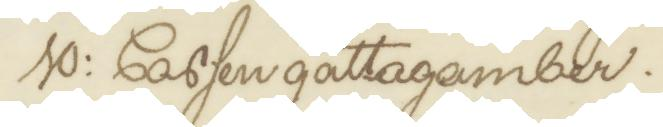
10: Cassen gattagamber
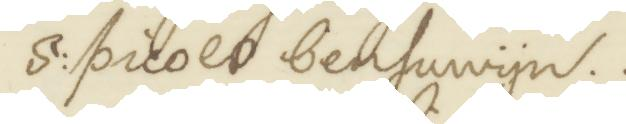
5: picols bensuwijn
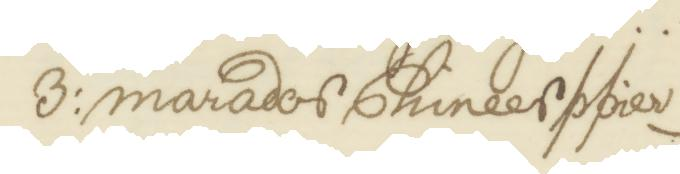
3: marados Chinees ppier
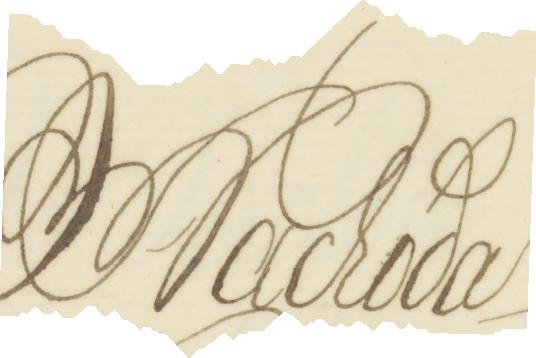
Nachoda
